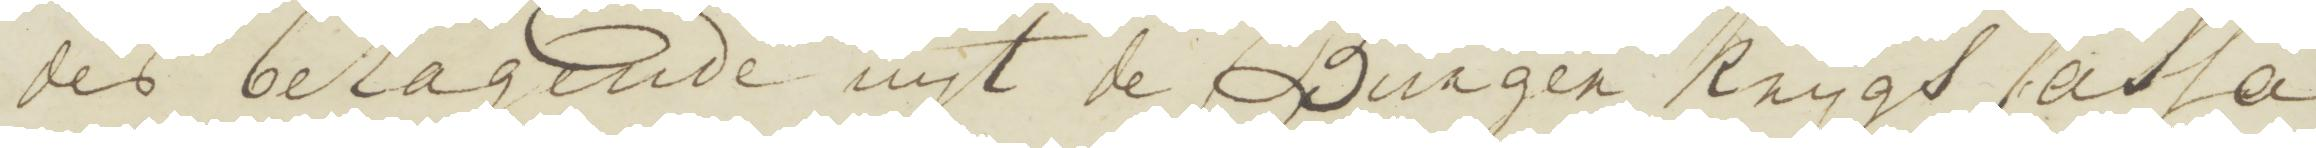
des behagende uijt de Burger krijgs Cassa
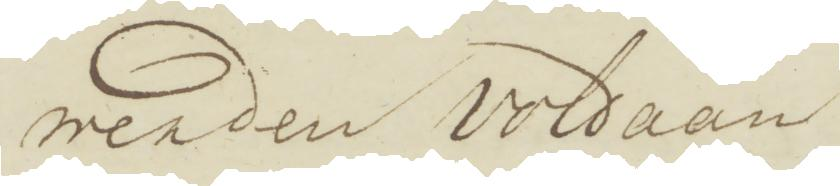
werden voldaan
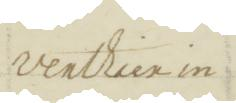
verthier in
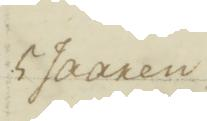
5 Jaaren
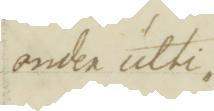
onder ulti
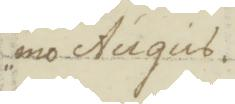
mo Augus
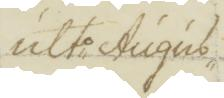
ult„o Augus
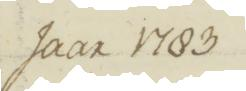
Jaar 1783
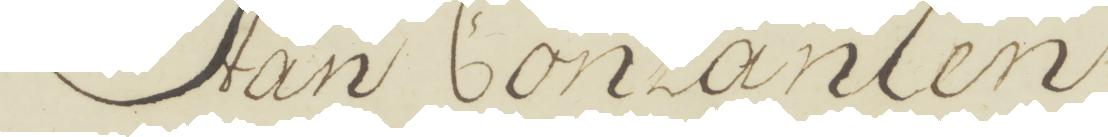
Aan Contanten
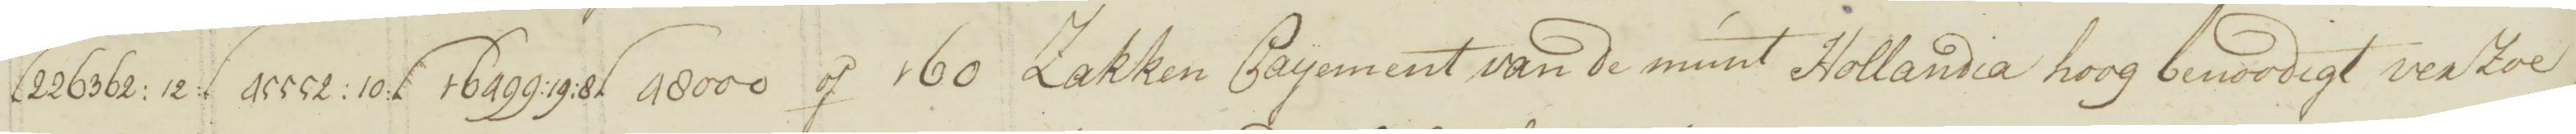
ƒ226362: 12:ƒ 45552: 10:ƒ 16499:19:8ƒ 48000 of 160 Zakken Paijement van de munt Hollandia hoog benoodigt verzoe
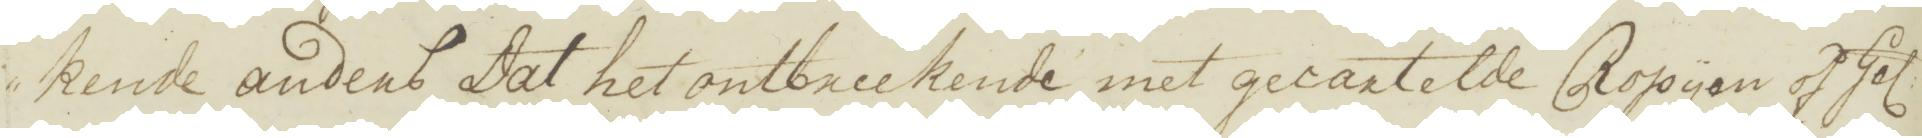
„kende anders Dat het ontbreekende met gecartelde Ropijen of Gec
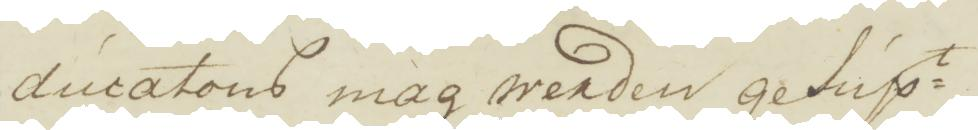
ducatons mag werden gesup=t
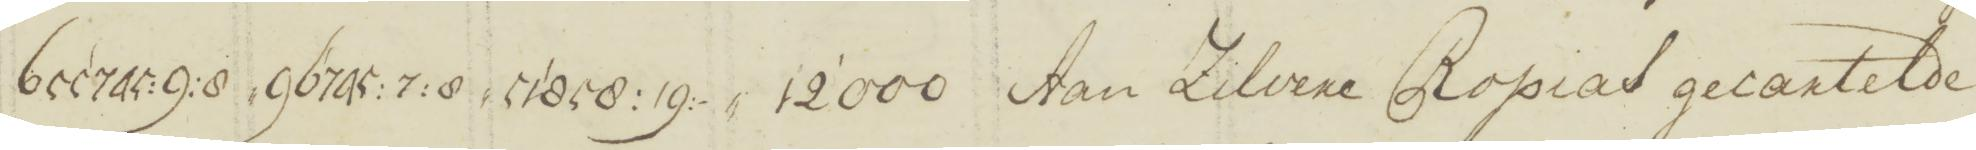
655'745:9:8 „ 96'745:7:8 „ 51'858:19:- „ 12'000 Aan Zilvere Ropias gecartelde
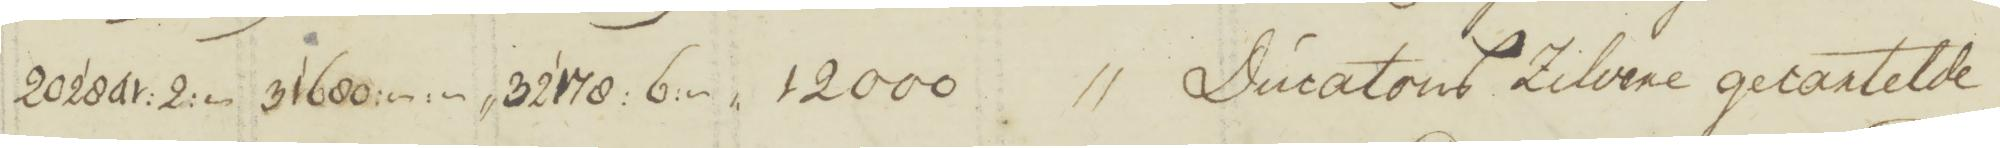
202'841:2:— 31'680:—:— „ 32'178:6:— „ 12000 „ Ducatons zilvere gecartelde
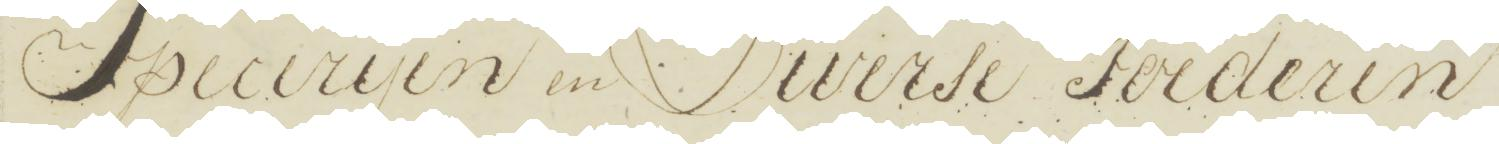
Specerijen en Diverse Goederen
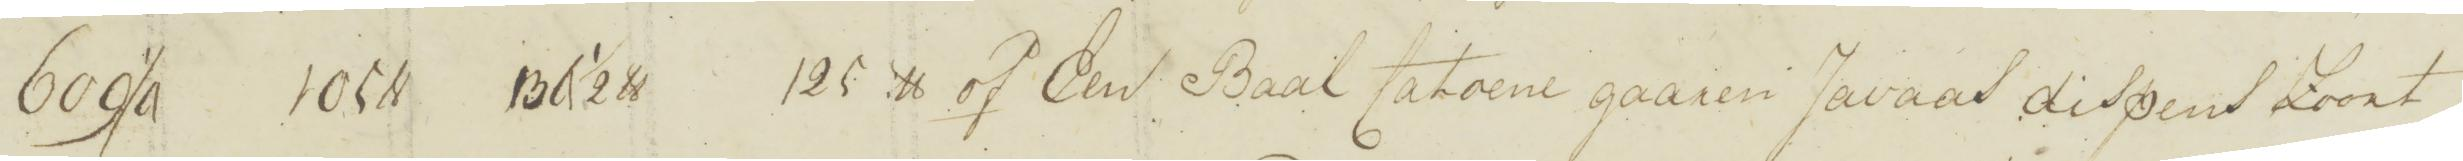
609¼ 1054 134½ lb 125 :lb of Een Baal Catoene gaaren Javaas dispens zoort
